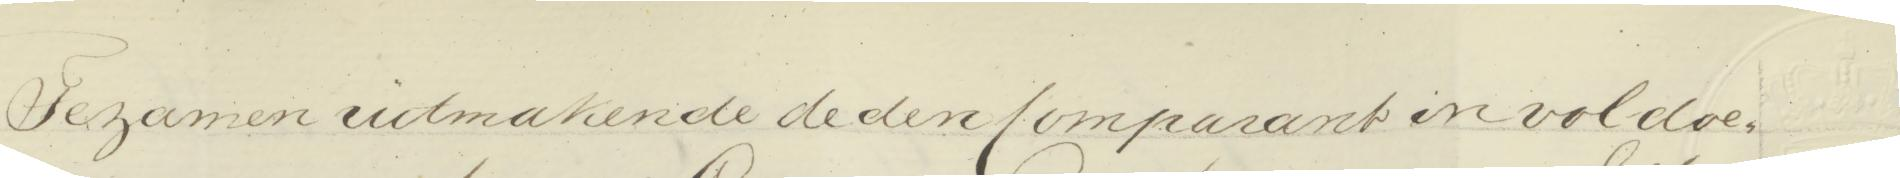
Tezamen uitmakende de den Comparant in voldoe„
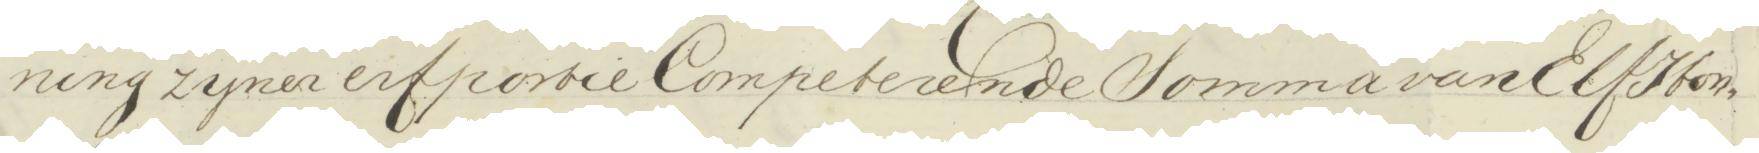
ning zyner erfportie Competerende Somma van Elf Hon„
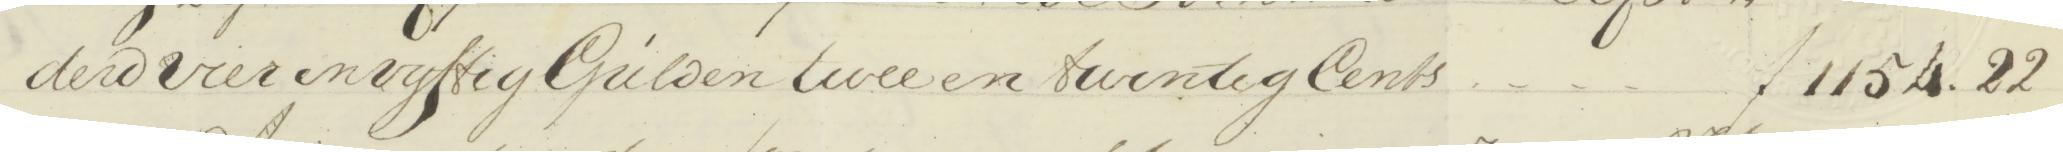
derd vier en vyftig Gulden twee en twintig Cents . . . . . ƒ1154.22
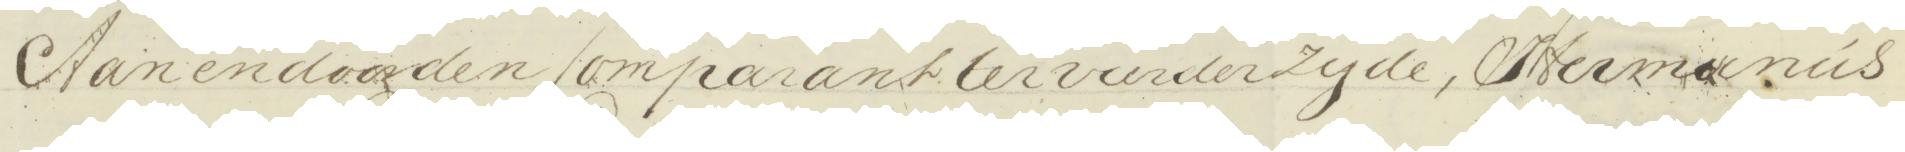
Aan en door den Comparant, ter vierder zyde, Hermanus
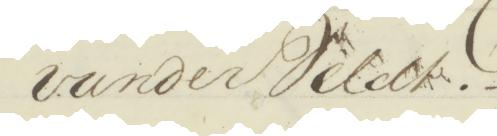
vander Veldt.
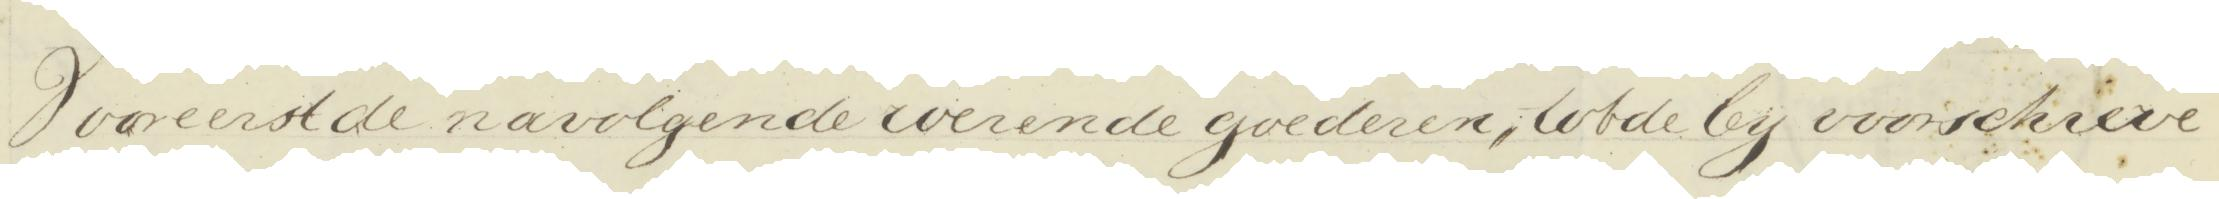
Vooreerst de navolgende roerende goederen, tot de bij voorschreve
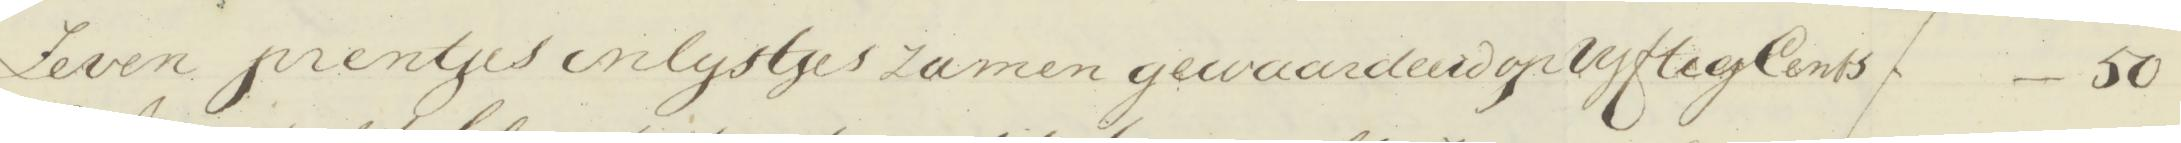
Zeven prentjes in lystjes zamen gewaardeerd op vyftig Cents ƒ — 50
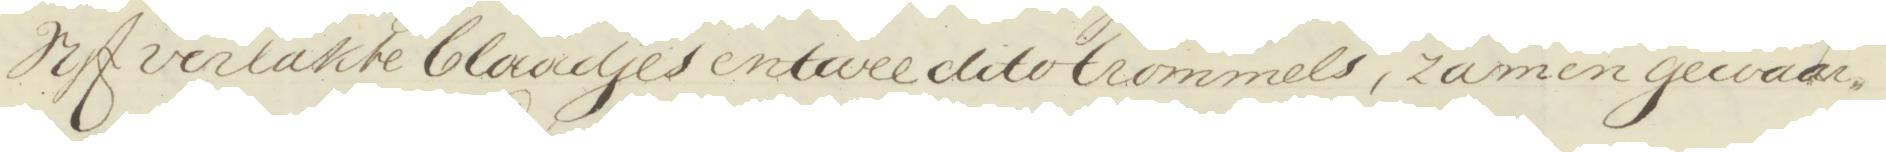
Vyf verlakte blaadjes en twee dito trommels, zamen gewaar„
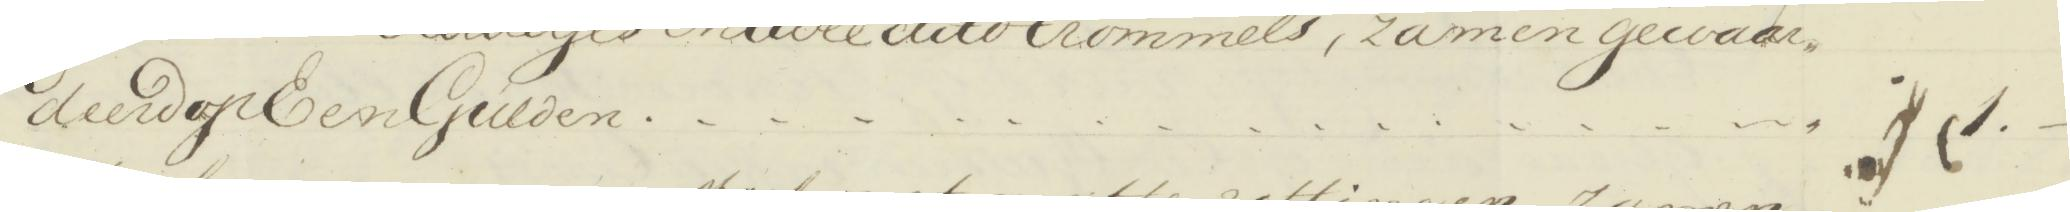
deerd op Een Gulden. ƒ 1. —
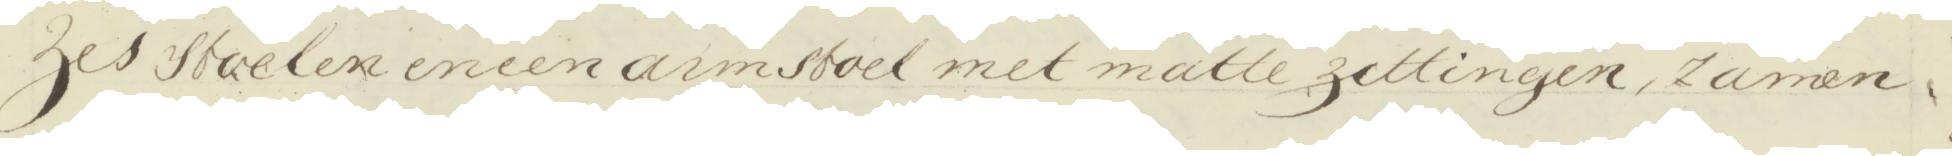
Zes stoelen en een armstoel met matte zittingen, zamen
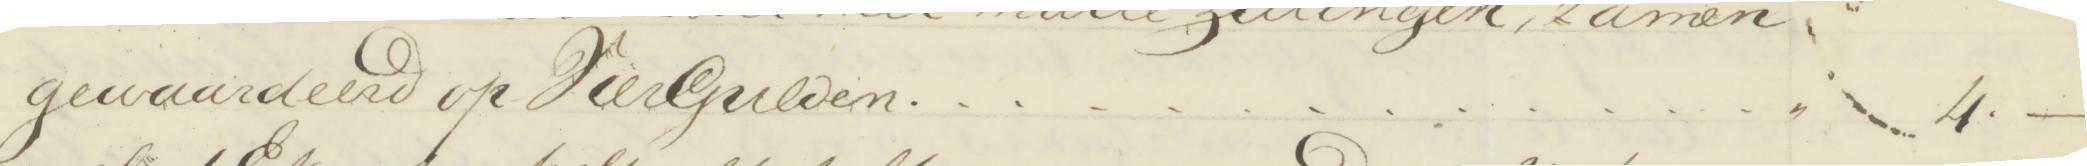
gewaardeerd op Vier Gulden. . . . . . . . . . . . . . „ 4. —
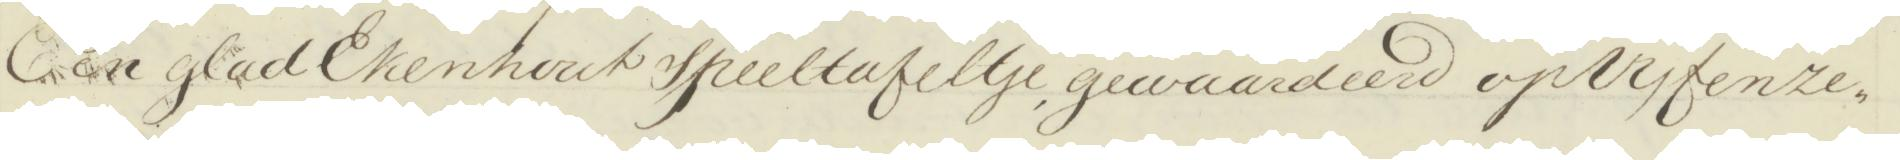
Een glad Ekenhout speeltafeltje, gewaardeerd op Vyf en ze„
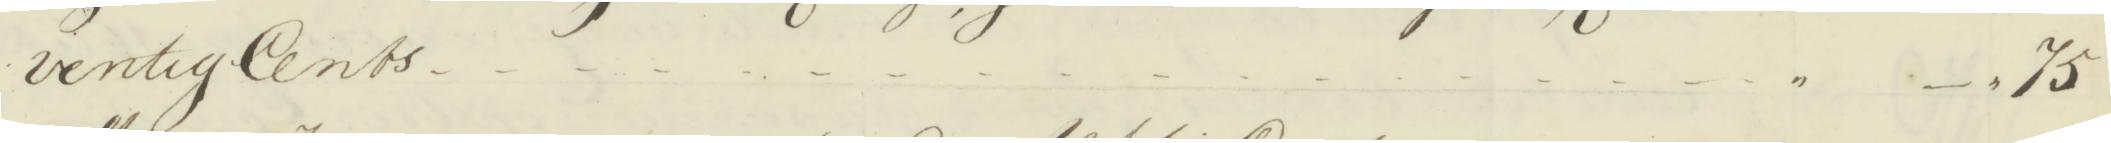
ventig Cents . . . . . . . . . . . . . . . . . . . . „ - „ 75
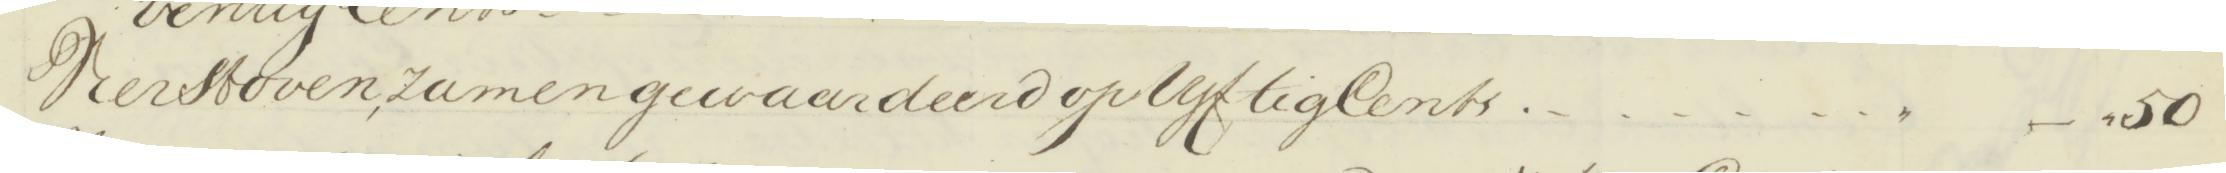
Vier stoven, zamen gewaardeerd op vyftig Cents. . . . . . . . „ - „50
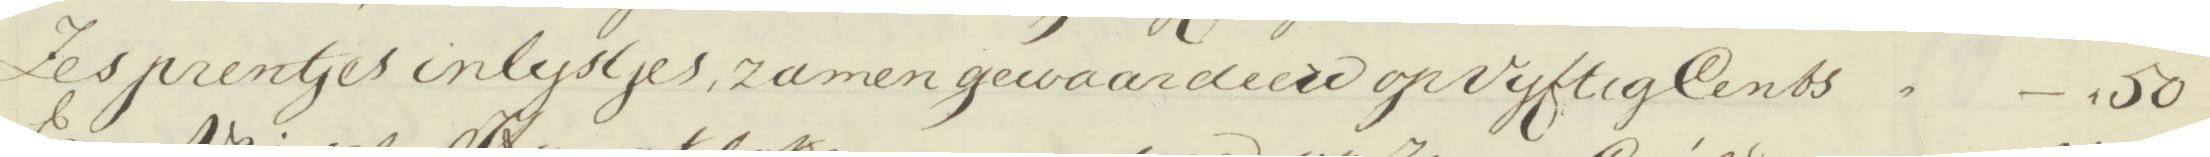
zes prentjes in lystjes, zamen gewaardeerd op vyftig Cents „ - „ 50
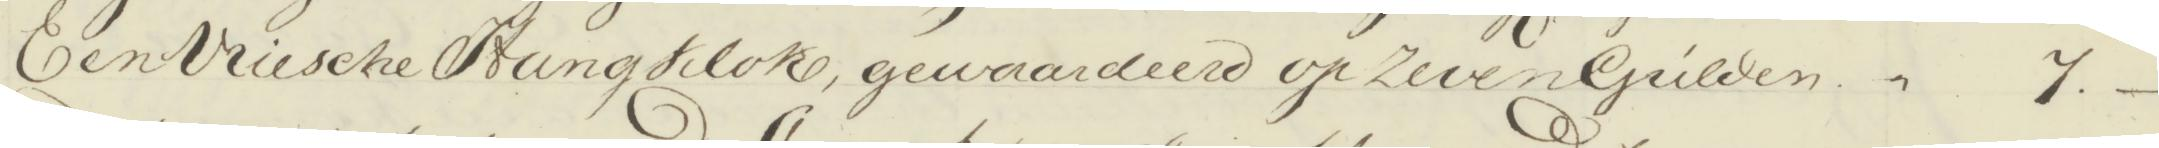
Een Vriesche Hangklok, gewaardeerd op zeven Gulden. „ 7. —
